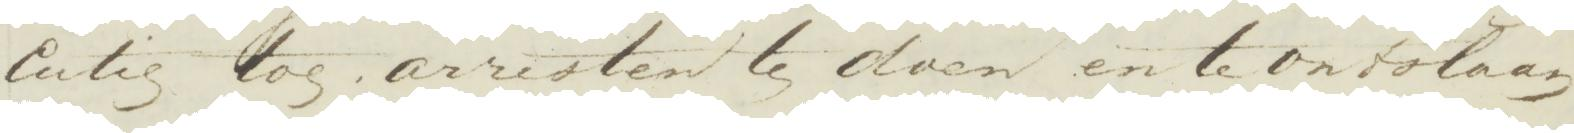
Cutie toe, arresten te doen en te ontslaan
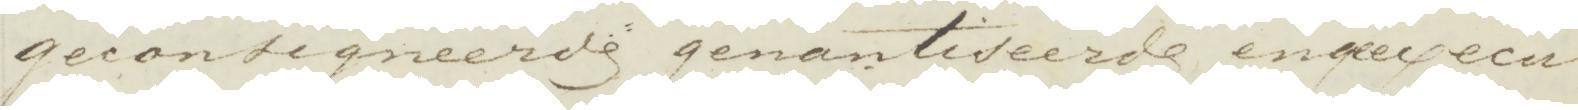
geconsigneerde genantiseerde en geexecu
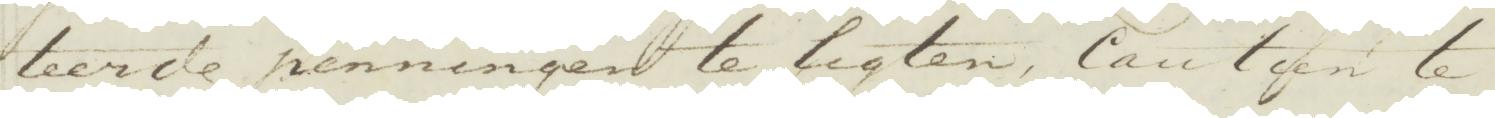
teerde penningen te ligten, Cautien te
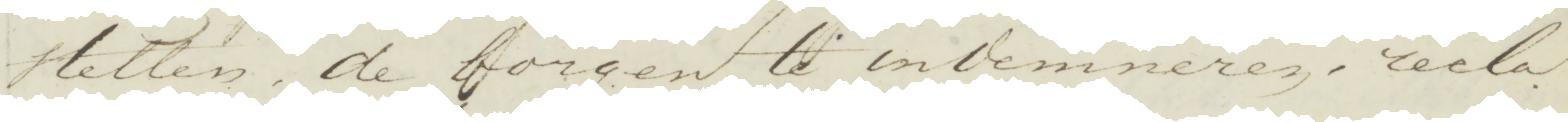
stellen, de borgen te indemneren, recla
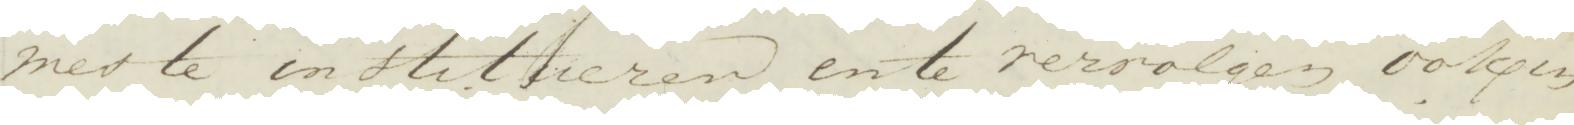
mes te institueren en te vervolgen ook in
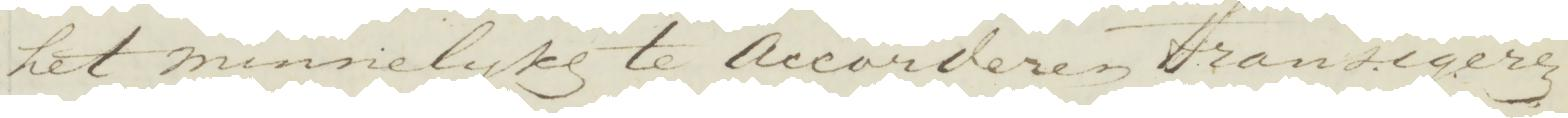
het minnelyke te accorderen Transigeren
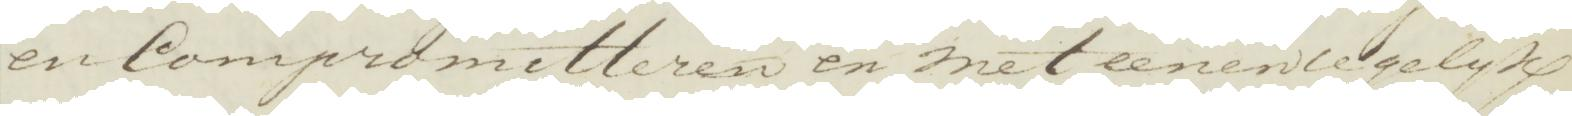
en Compromitteren en met een en tegelyk
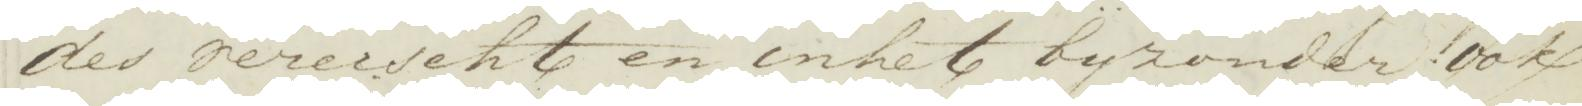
des vereischt en in het bijzonder ook
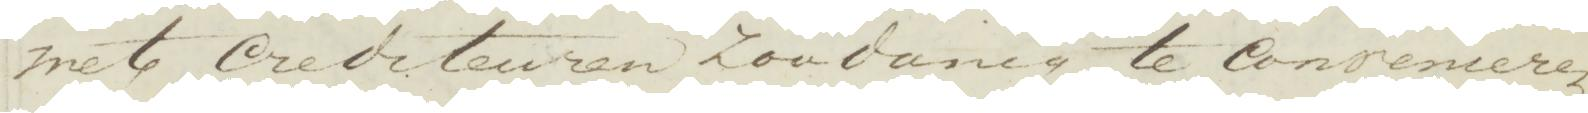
met Crediteuren zoodanig te convenieren
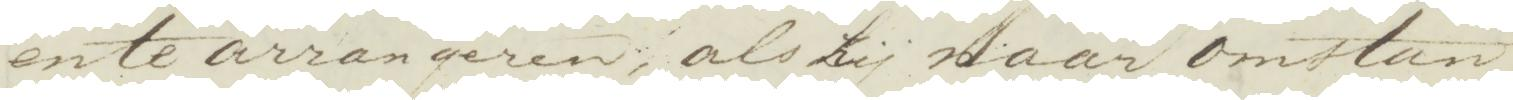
en te arrangeren, als zij naar omstan
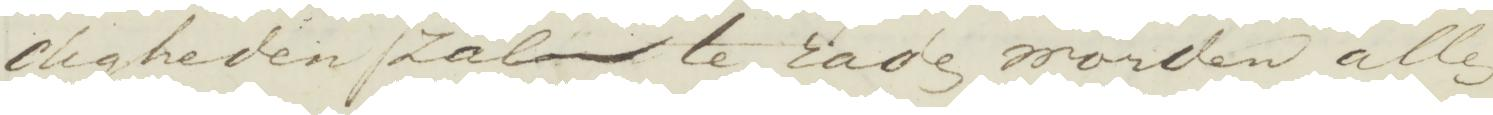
digheden zal te rade worden alle
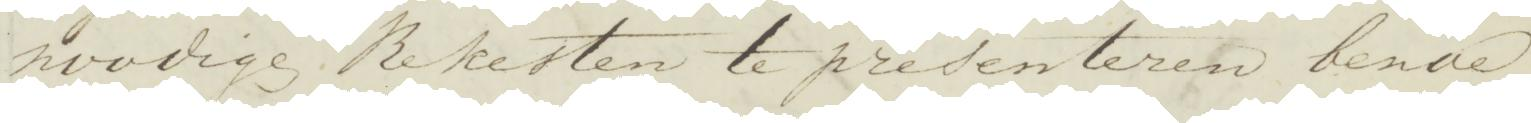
noodige Rekesten te presenteren benoe
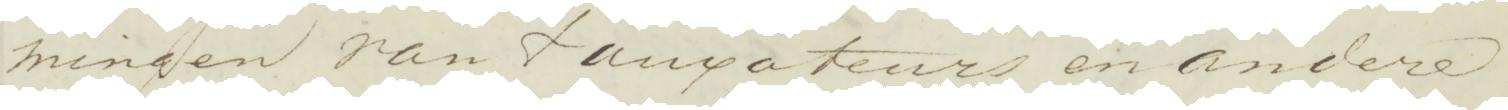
mingen van tauxateurs en andere
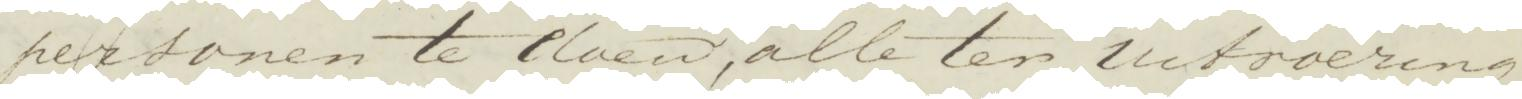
personen te doen, alle ter uitvoering
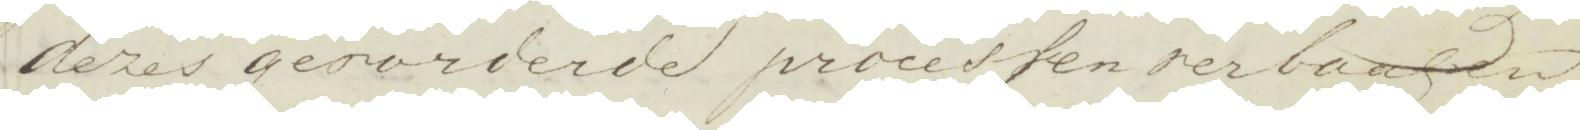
dezes gevorderde processen verbaal en
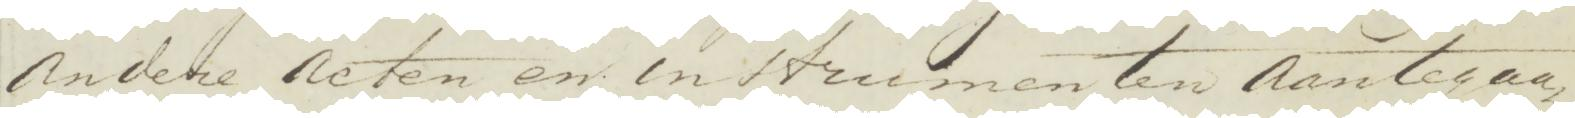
andere acten en instrumenten aantegaan
